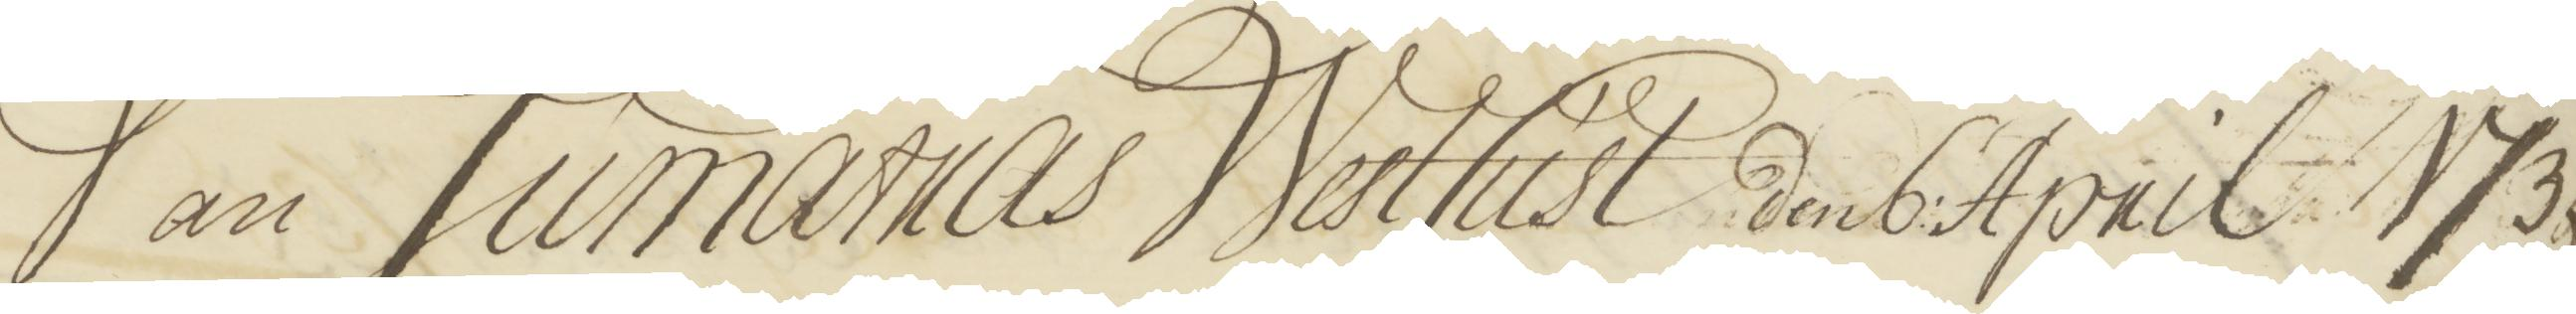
Van Sumatras West Cust den 6: April 173
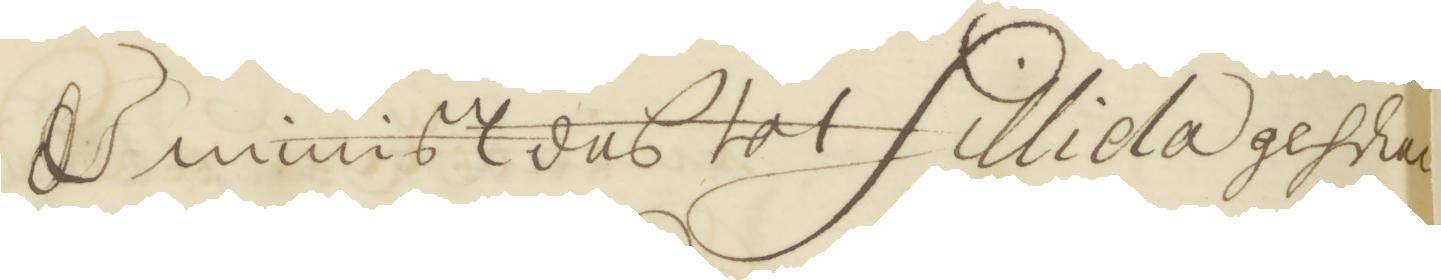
de ministers tot Sillida geschr
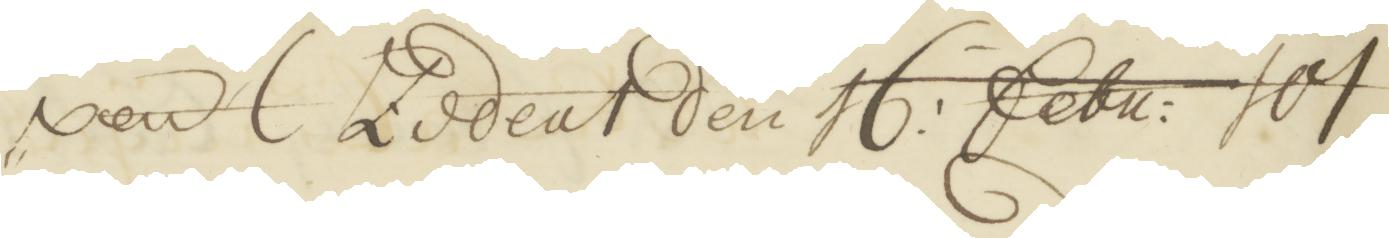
„ven ’t Zedert den 16:' febr: tot
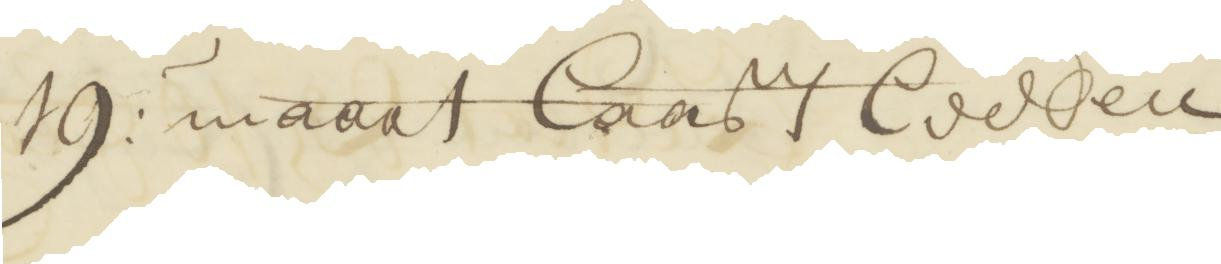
19:' maart laast leeden
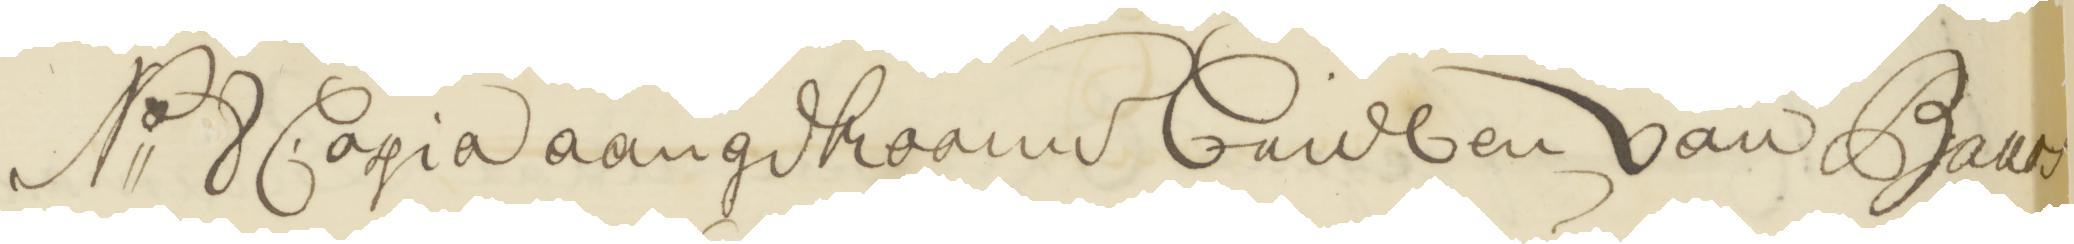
N„o 8 Copia aangekoome brieven van Baros
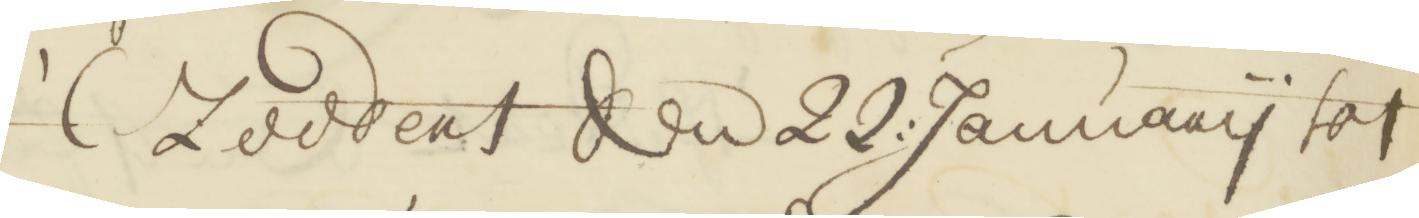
't Zeedert den 22. Januarij tot
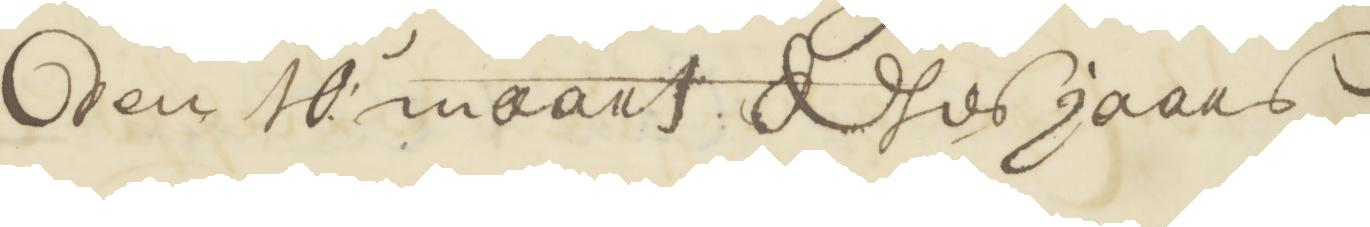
den 10:' maart deses jaars
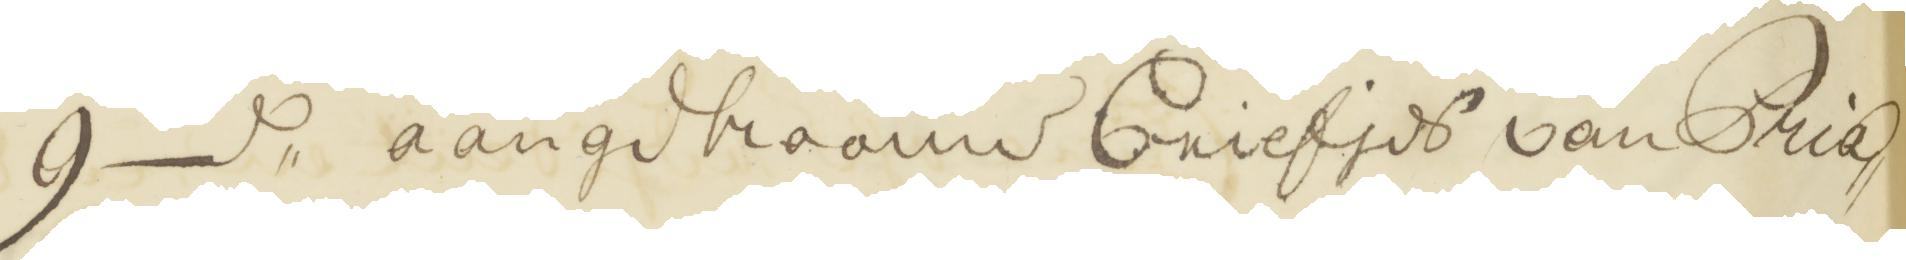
9 _„o aangekoome briefjes van Pria„
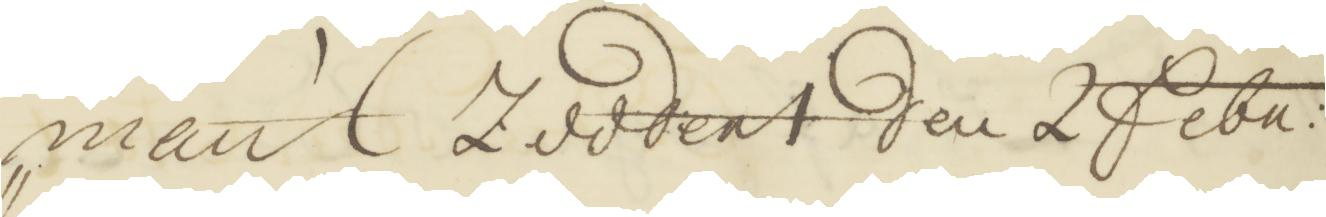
„man ’t zeedert den 2 febr:
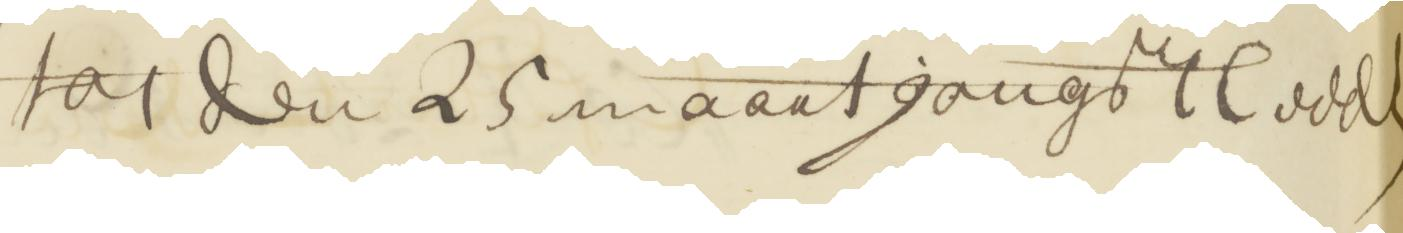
tot den 25 maart jongst leeden
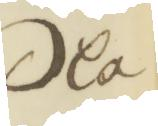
lo
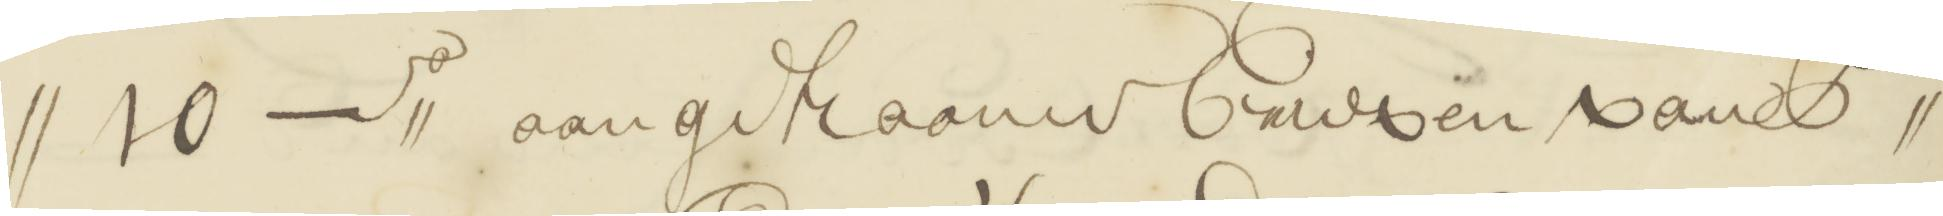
„ 10 _„o aan gekoome brieven van P„
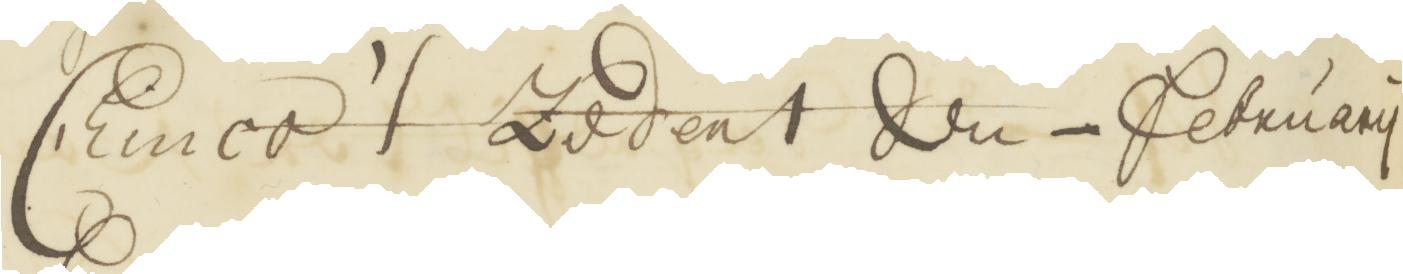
Chinco ’t zedert den _ februarij
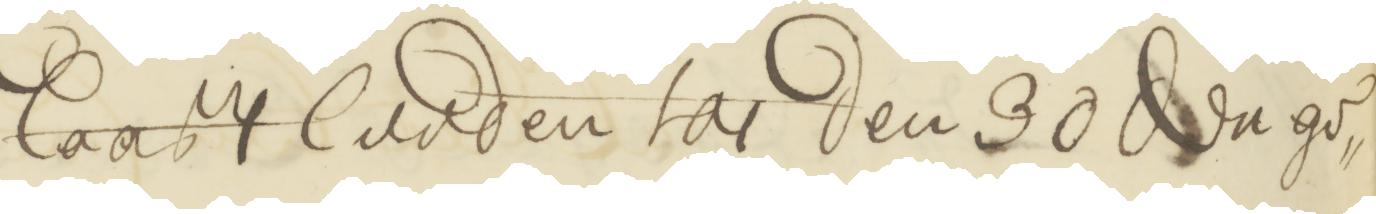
laast leeden tot den 30 der ge„
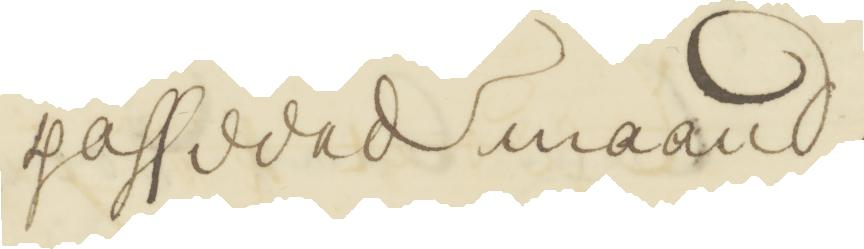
passeerde maand
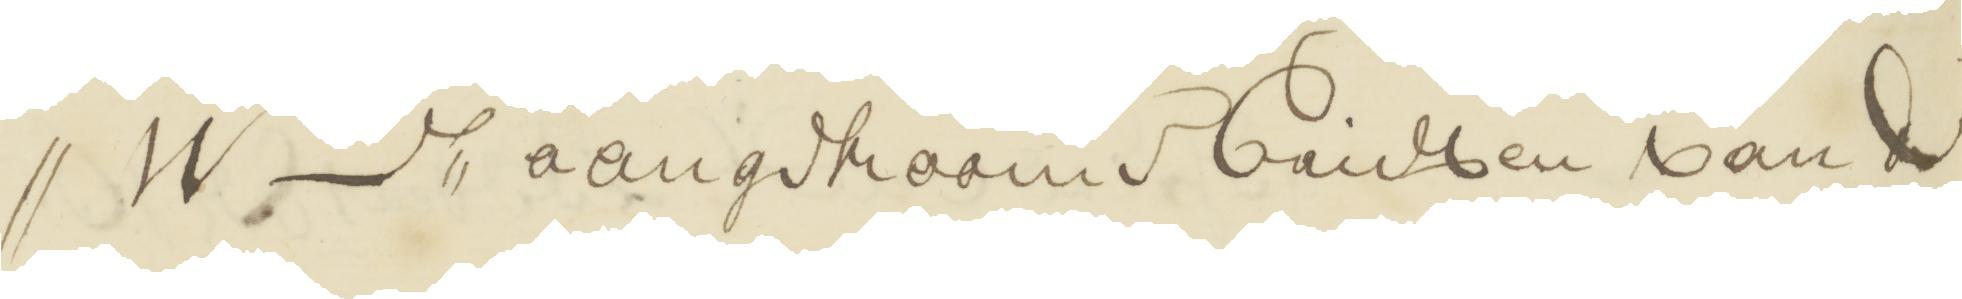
„ 11 _„o aangekoome brieven van de
